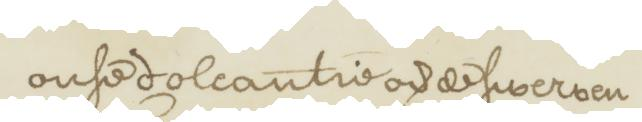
onse doleantie over de swerven
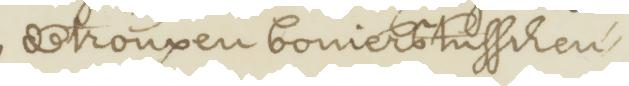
de troupen boniers tusschen
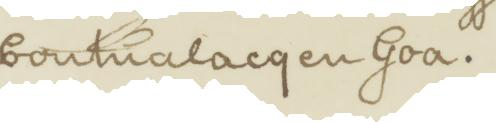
Bontualacq en Goa.
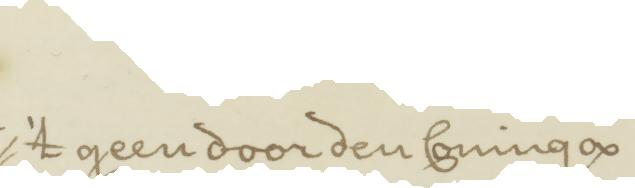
’t geen door den Coning op
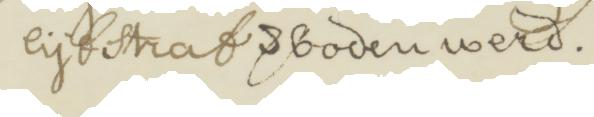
lijfstraf verboden werd.
